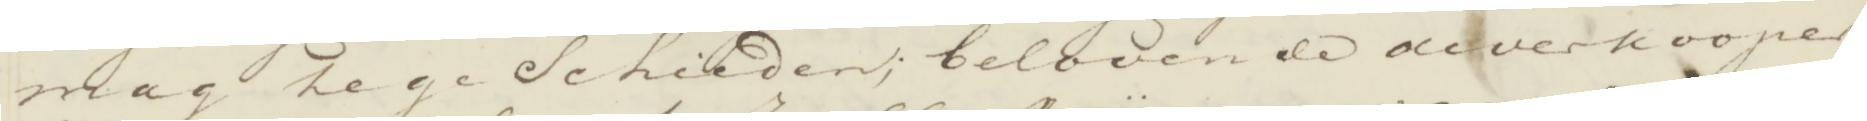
mag te geschieden; beloven de de verkooper
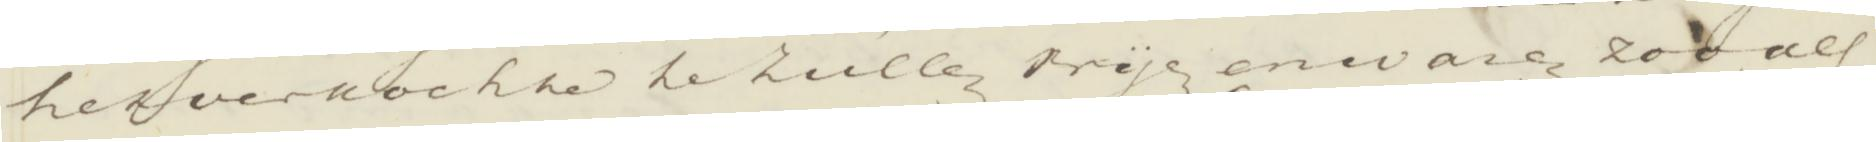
het verkochte te zullen vrijen en waren zoo als
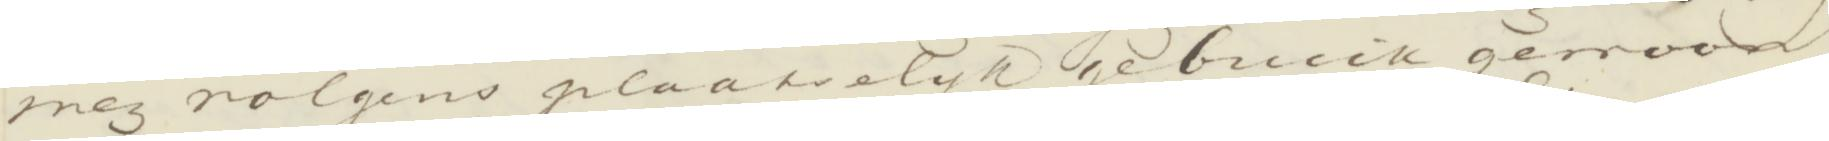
men volgens plaatselyk gebruik gewoon
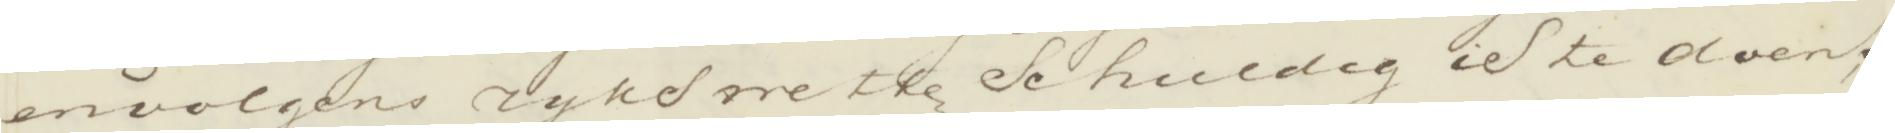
envolgens ryks wetten schuldig is te doen,
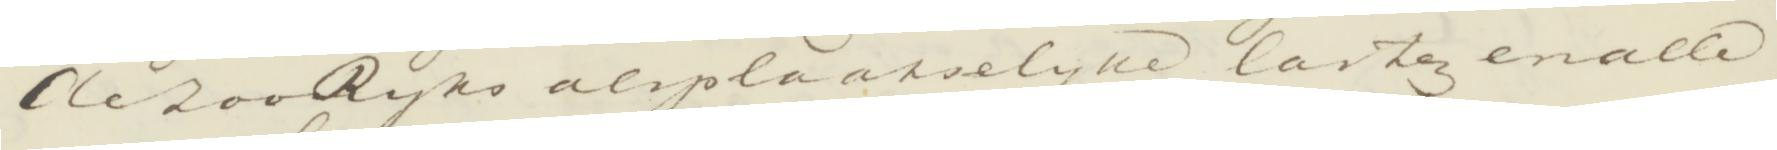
de zoo Ryks als plaatselijke lasten en alle
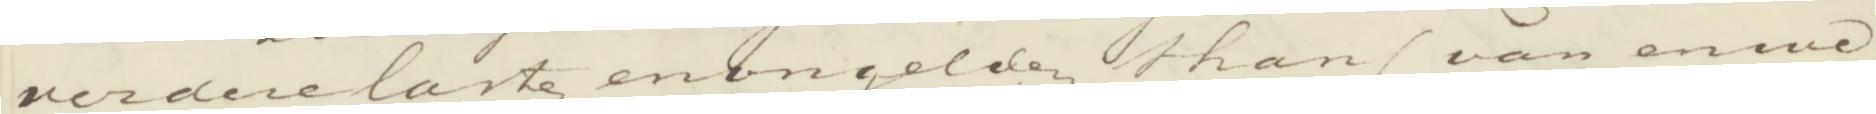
verdere lasten en ongelden thans van en we
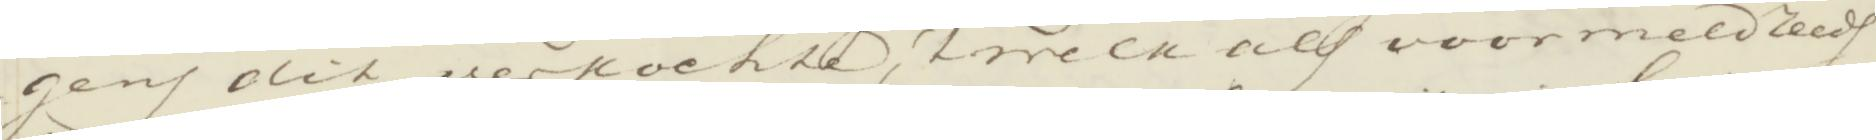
gens dit verkochte, 't welk als voormeld reeds
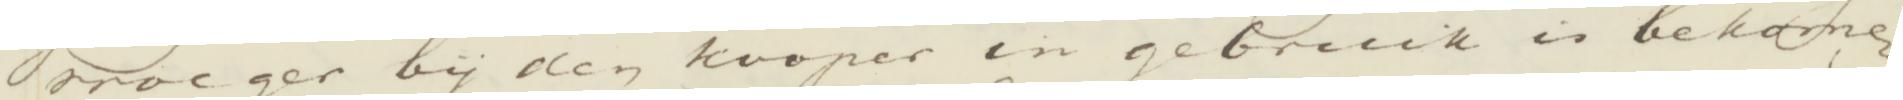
vroeger bij den kooper in gebruik is bekomen
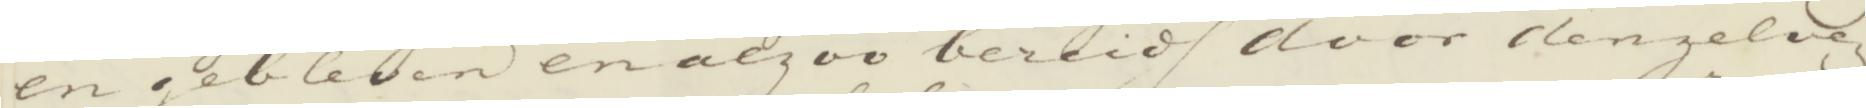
en gebleven en alzoo bereids door denzelven
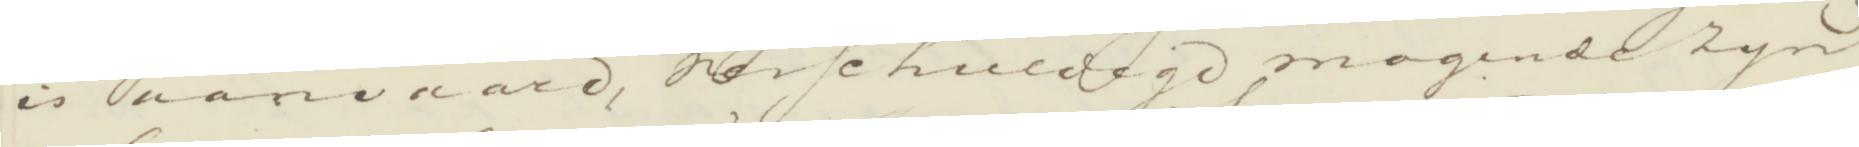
is aanvaard, verschuldigd mogende zyn
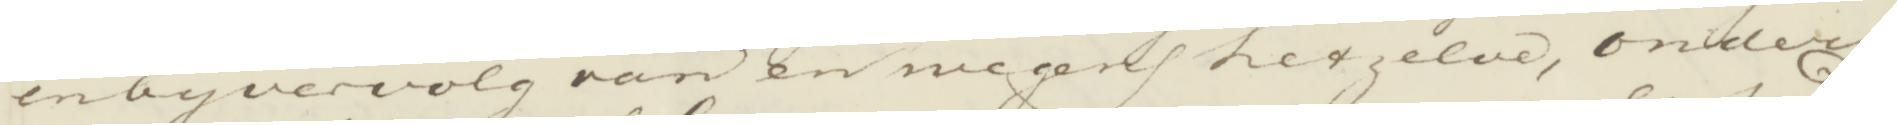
en by vervolg van en wegens hetzelve, onder
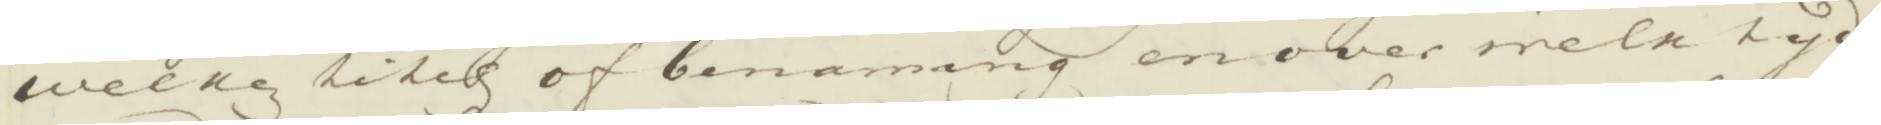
welke titel of benaming en over welk tyd
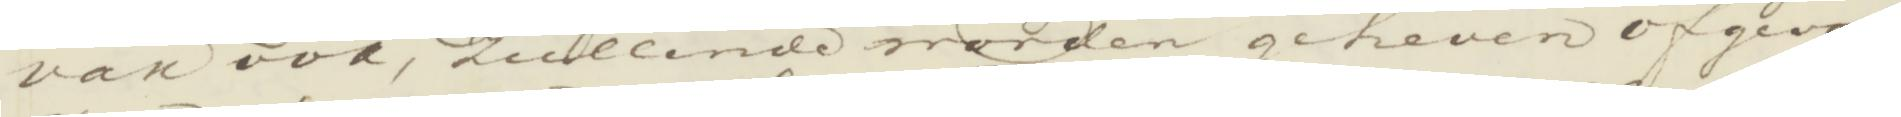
vak ook, zullende worden geheven of gevor
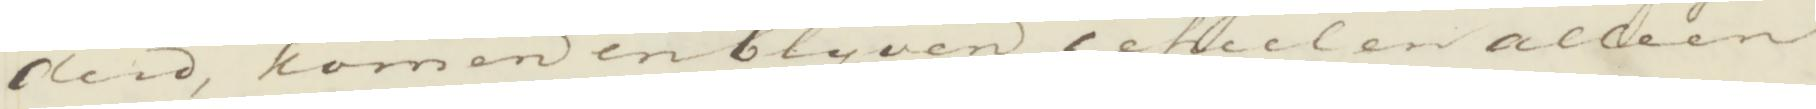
derd, komen en blyven geheel en alleen
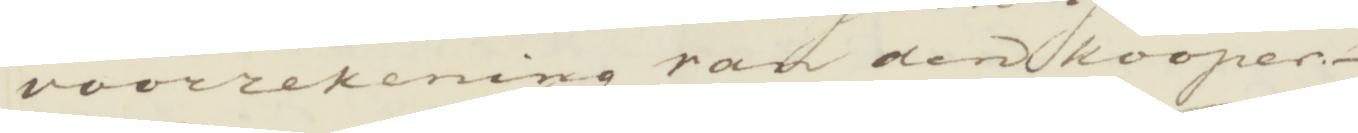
voorrekening van den kooper.-
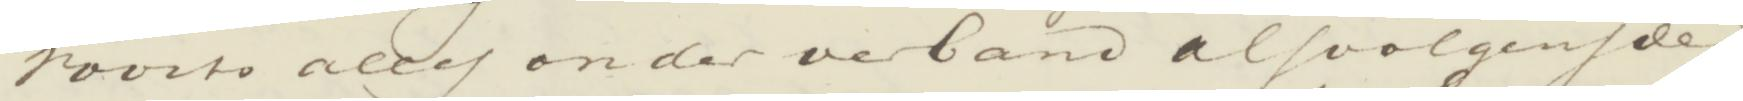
Voorts alles onder verband alsvolgens de
